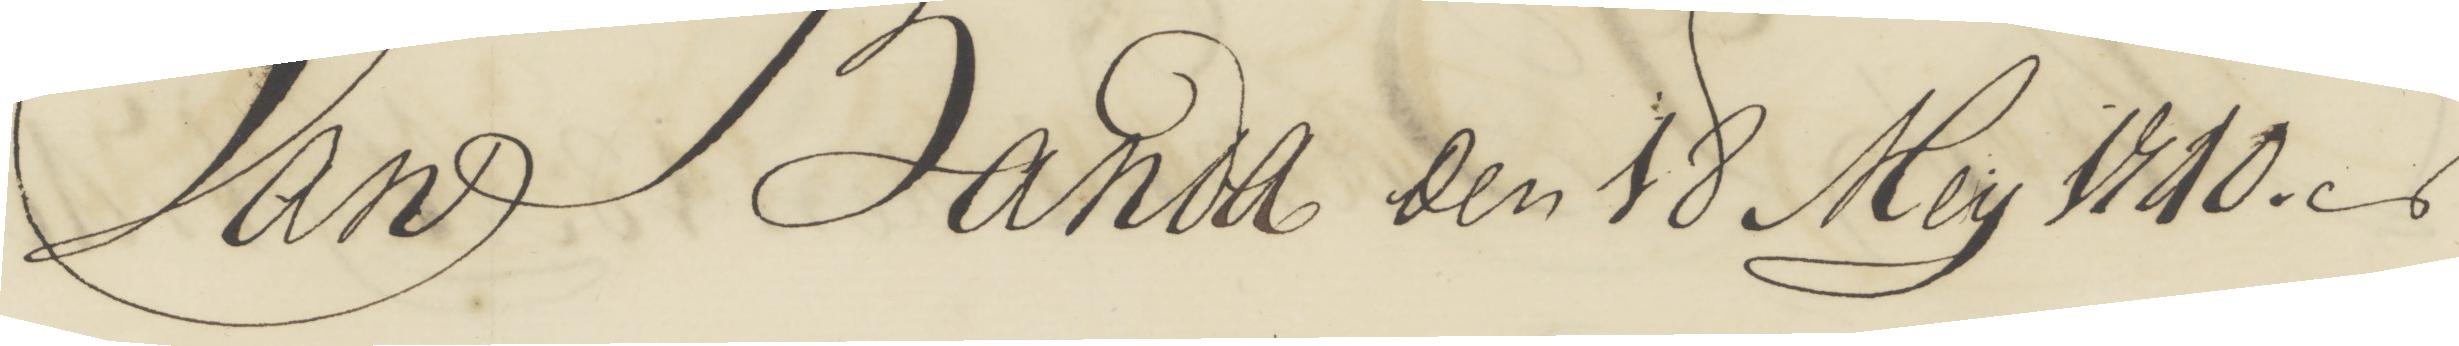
Van Banda den 18 Meij 1740. —
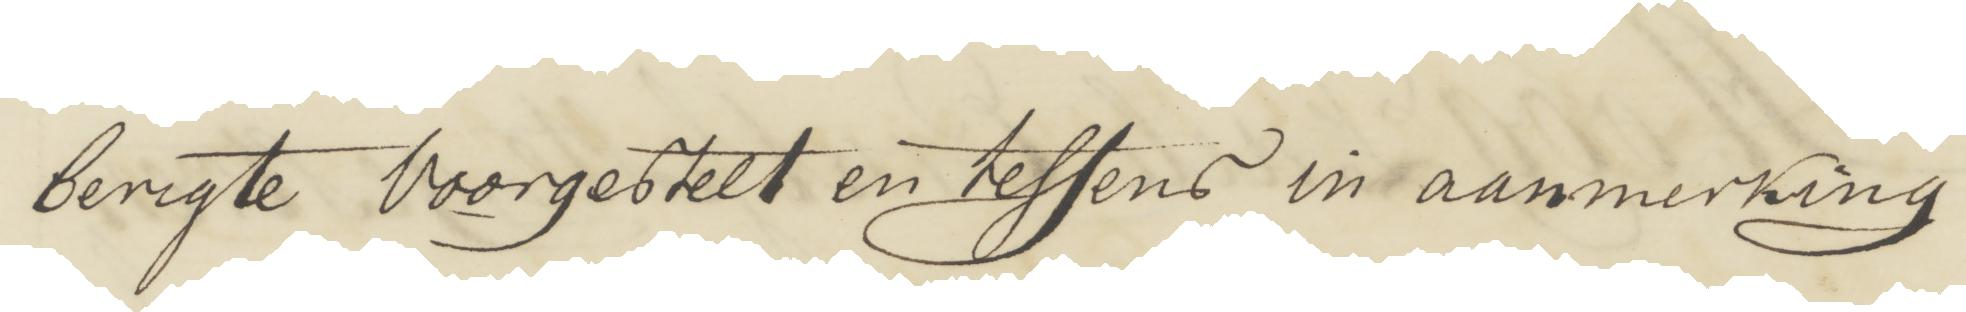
berigte Voorgestelt en teffens in aanmerking
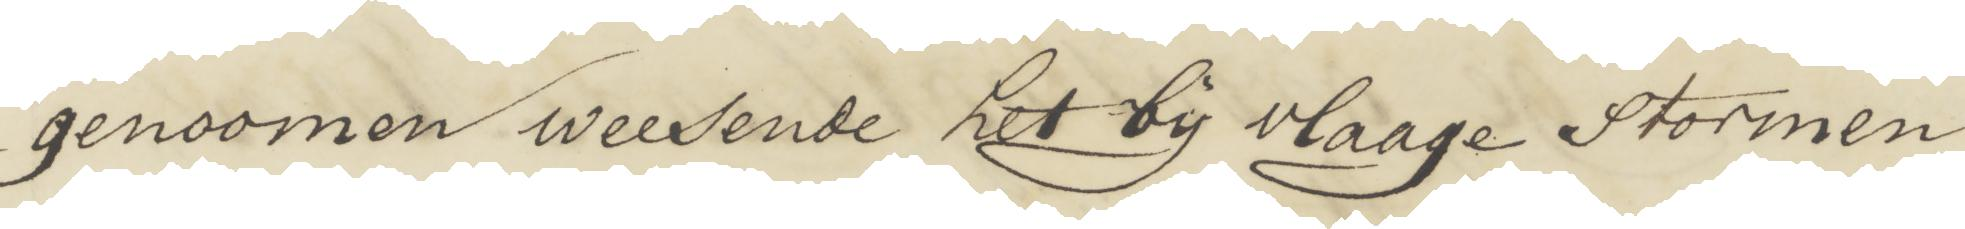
genoomen weesende het bij vlaage stormen
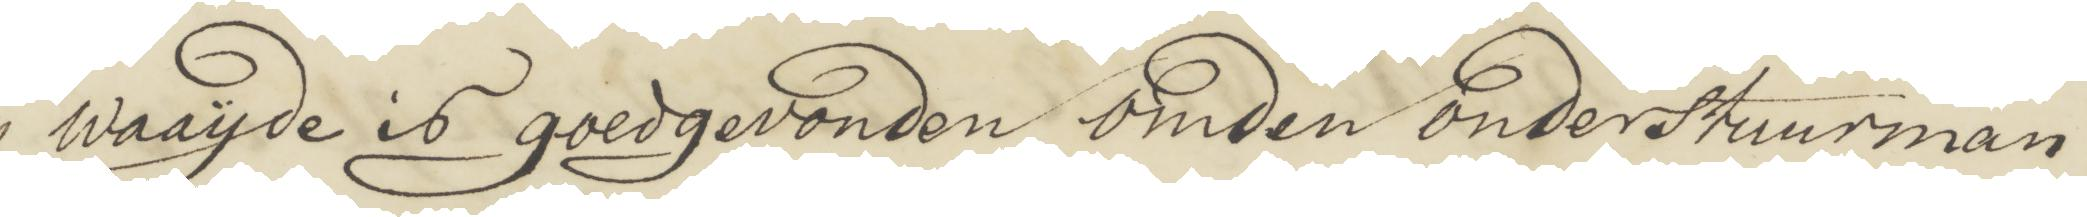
waaijde is goedgevonden omden onderstuurman
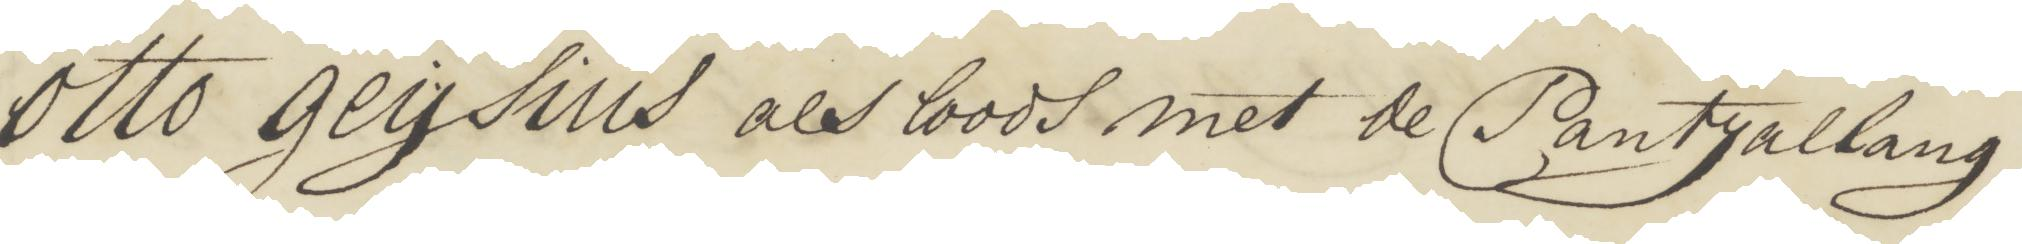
otto geijsius als loods met de Pantjallang
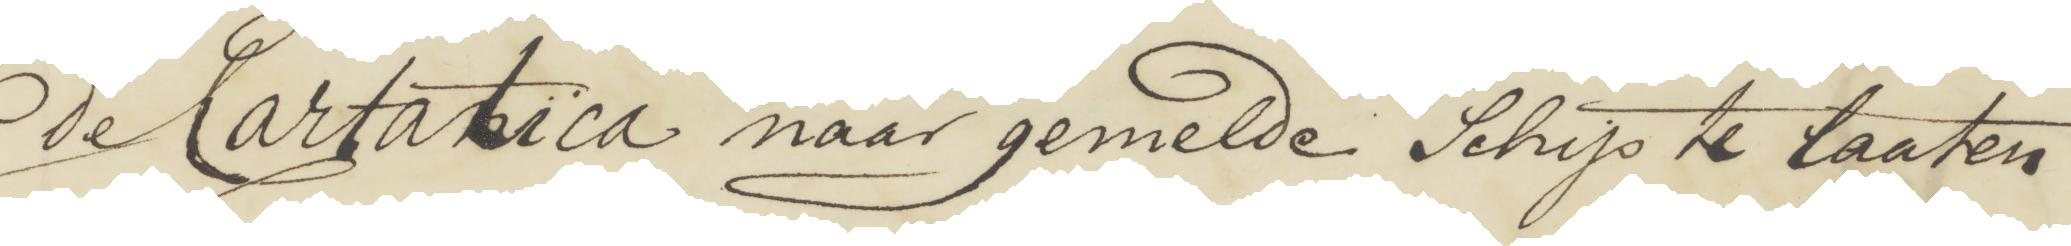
de Cartatica naar gemelde schip te laaten
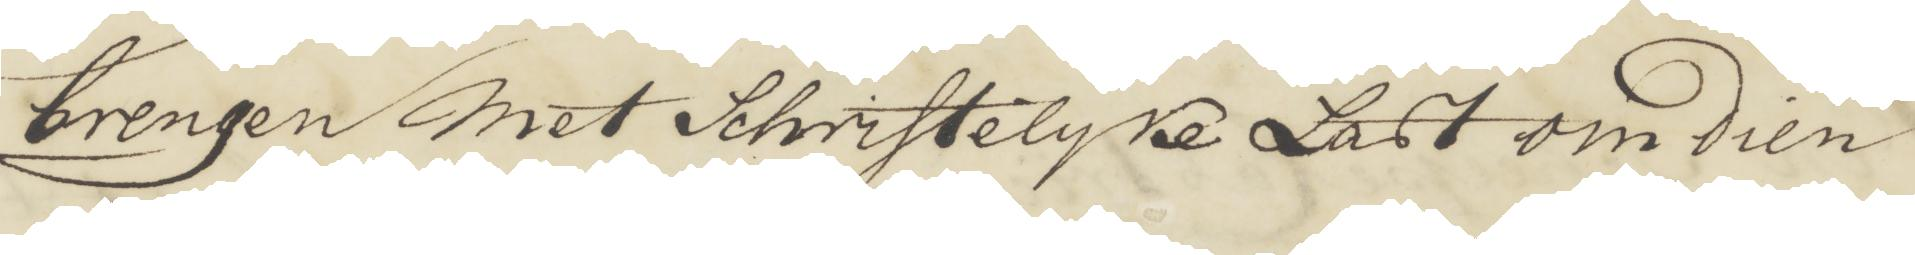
brengen met schriftelyke Last om dien
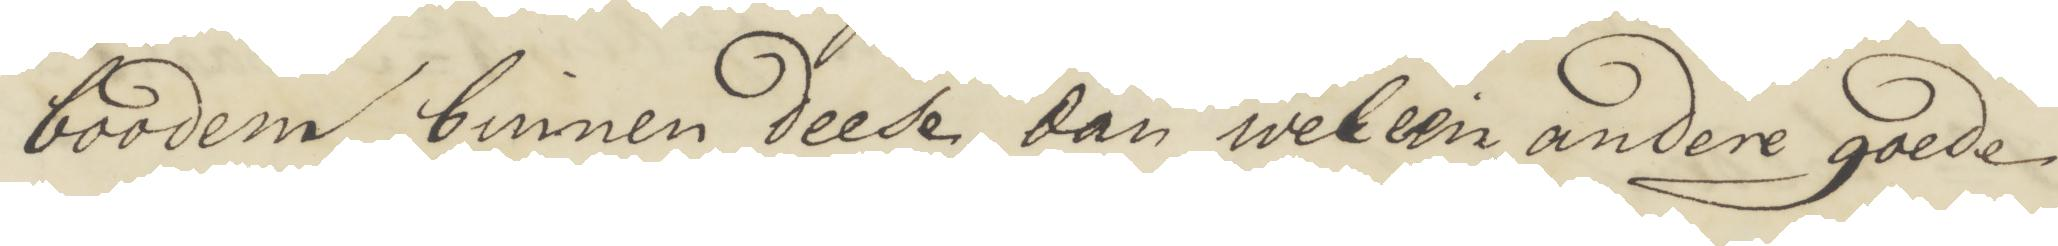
boodem binnen deese dan wel een andere goede
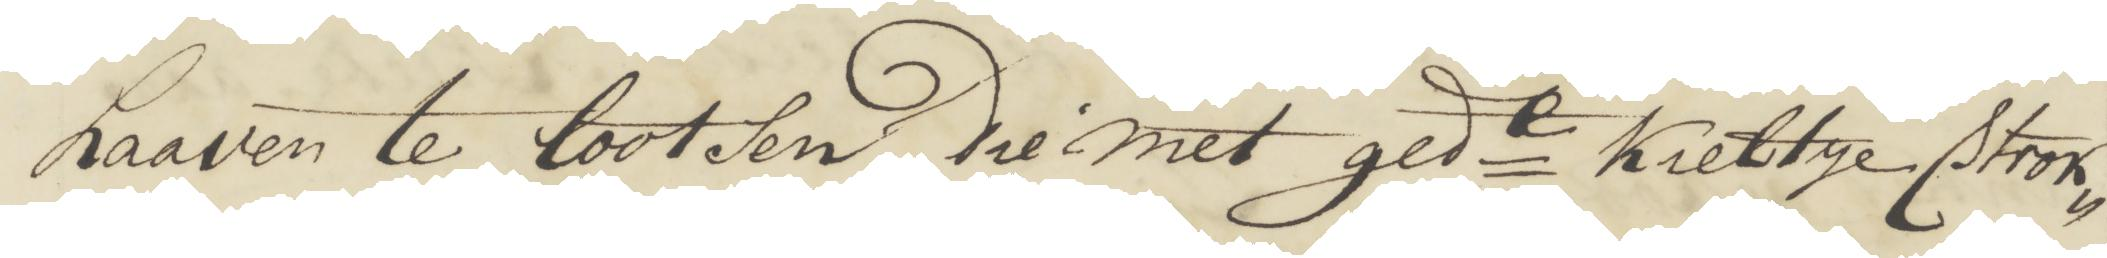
haaven te lootsen die met ged=t kieltje vertrok„
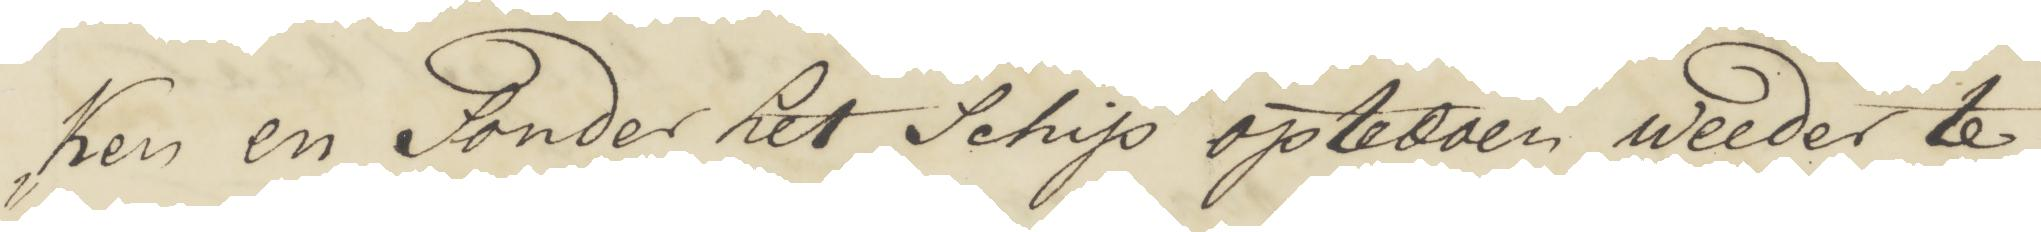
„ken en sonder het schip op tedoen weeder te
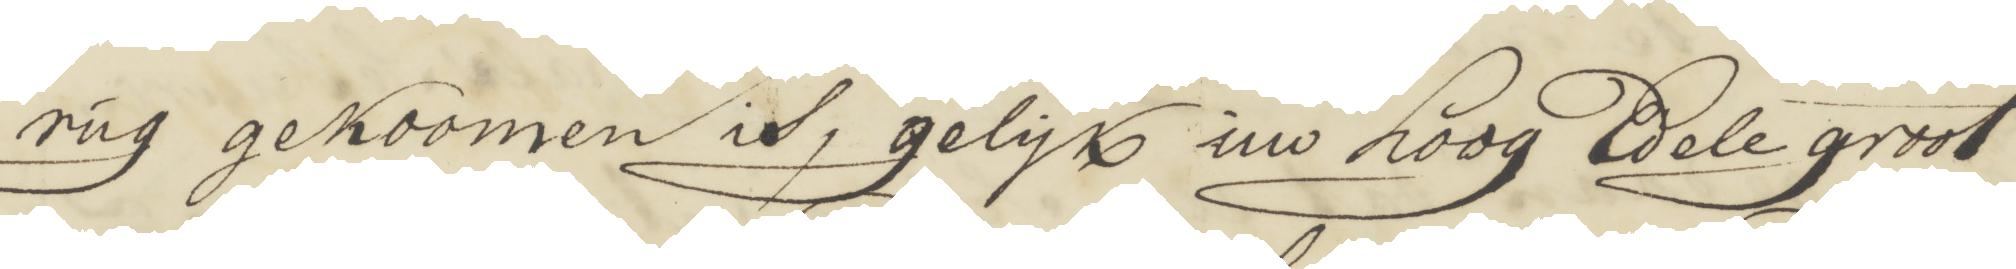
rug gekoomen is, gelijk uw hoog Edele groot
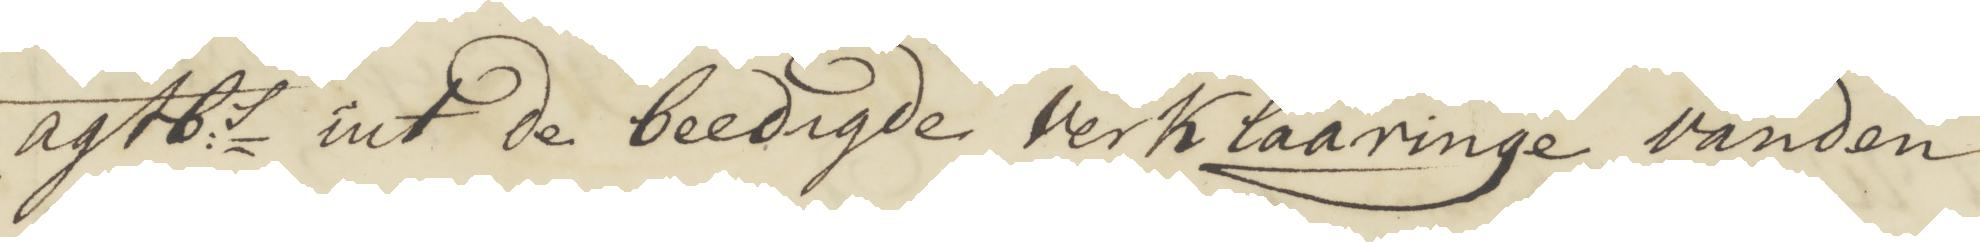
agtb:=s int de beedigde verklaaringe vanden
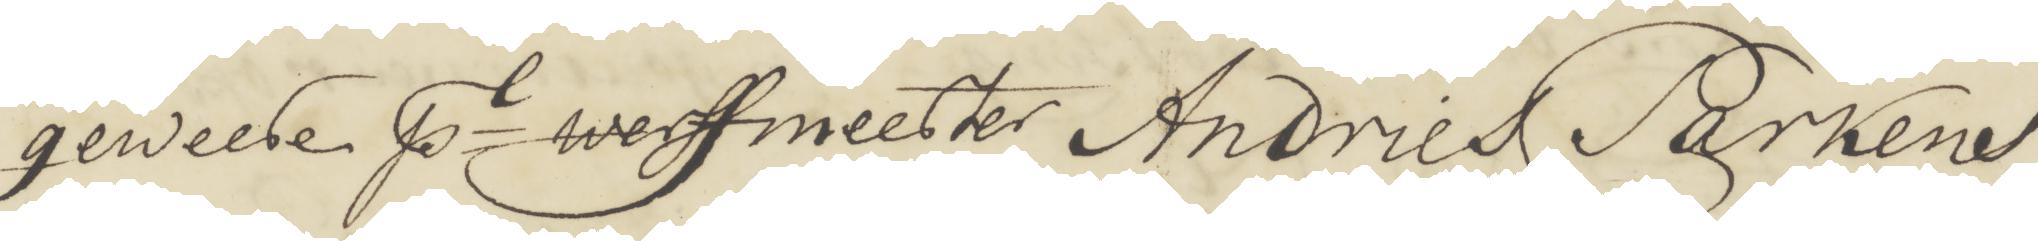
geweese p=l werffmeester Andries Parkens
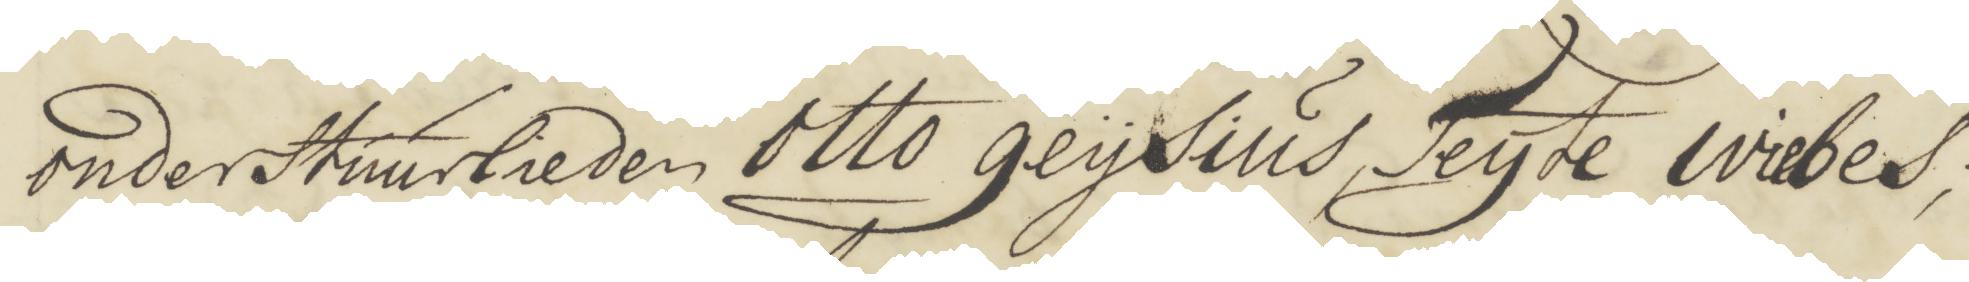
onderstuurlieden otto geijsius, Teijte wiebes;
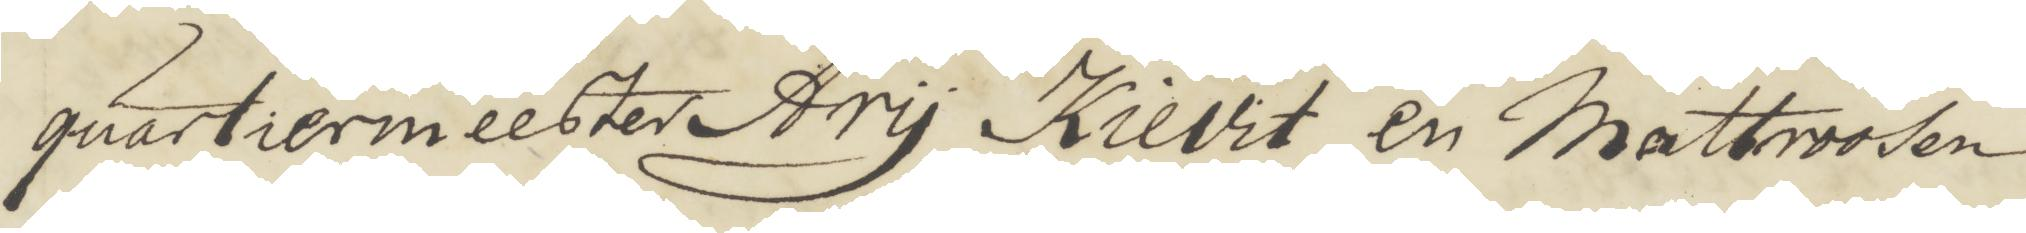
quartiermeester Arij Kievit en Mattroosen
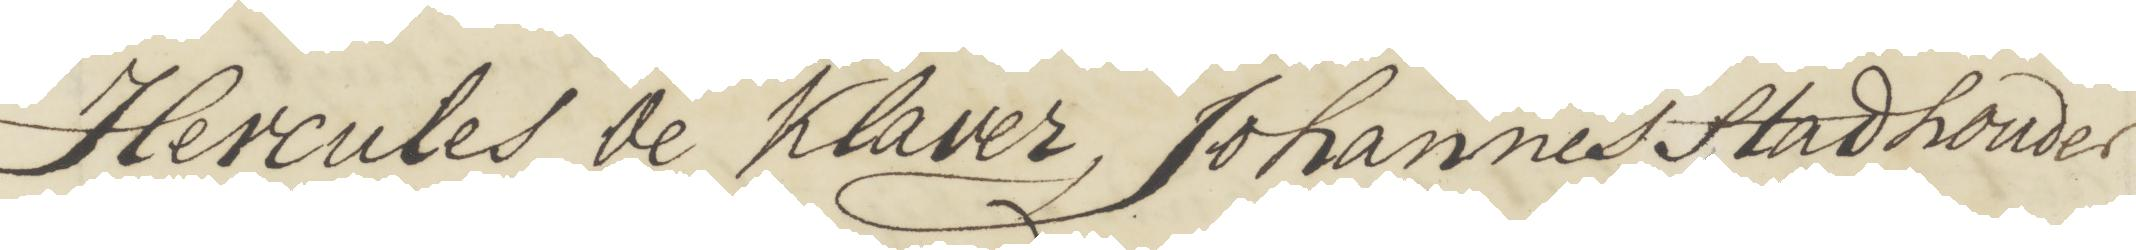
Hercules de Klaver, Johannes Stadhouder
